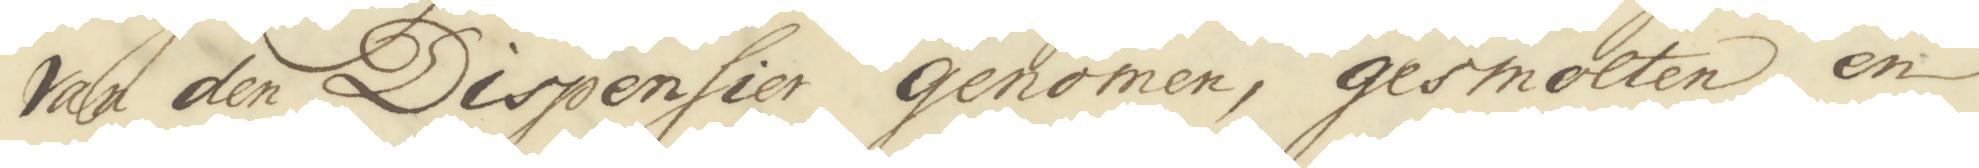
van den Dispensier genomen, gesmolten, en
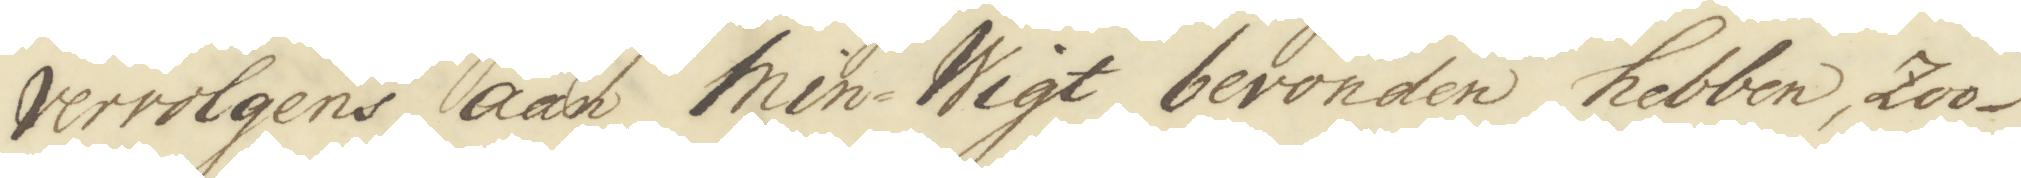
vervolgens aan Min=Wigt bevonden hebben, zoo_
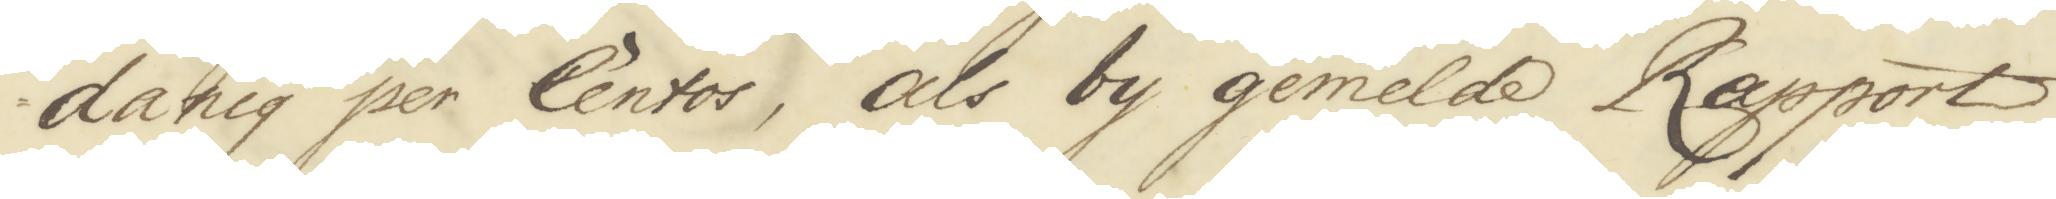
=danig per Centos, als by gemelde Rapport
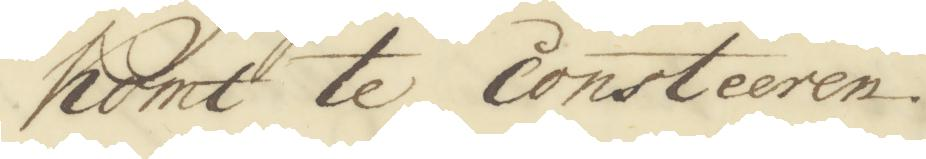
Komt te consteeren.
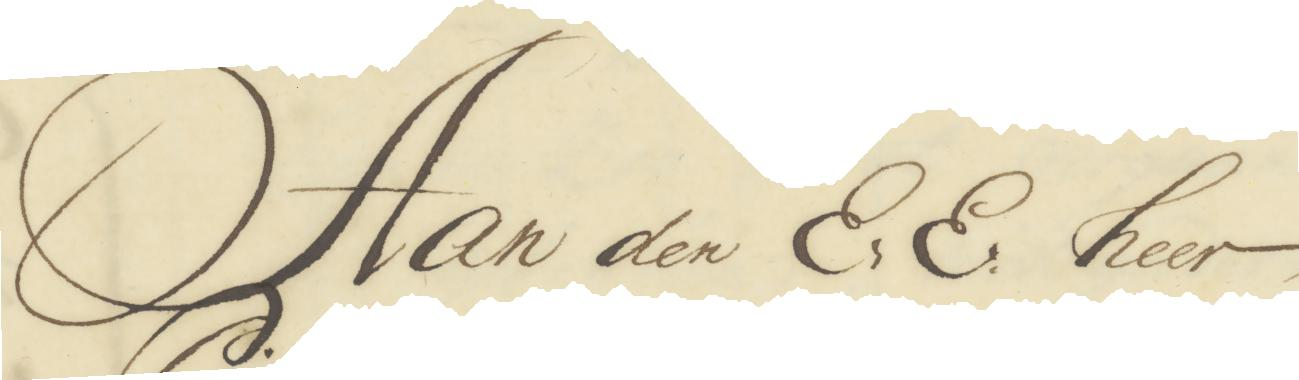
Aan der E: E: heer
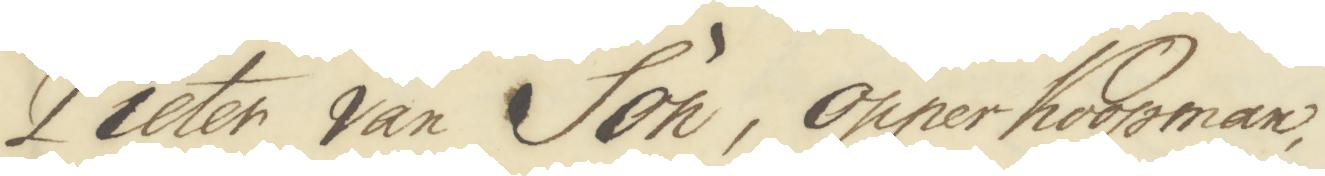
Pieter van Son, opperkoopman,
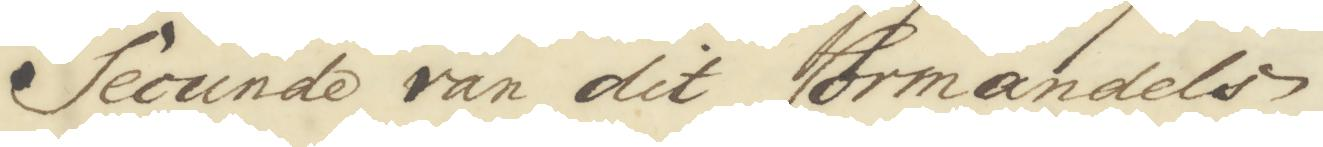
Secunde van dit Cormandels
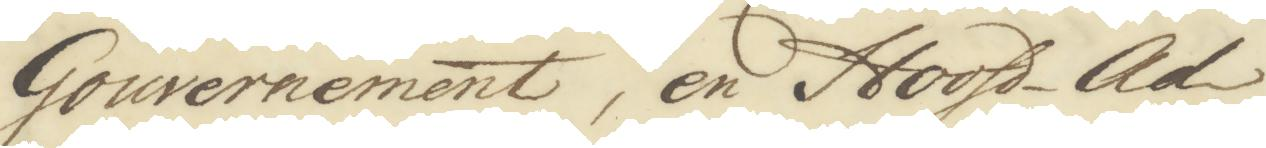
Gouvernement, en Hoofd-Ad=
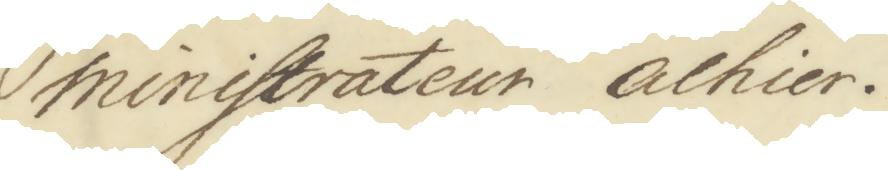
ministrateur alhier.
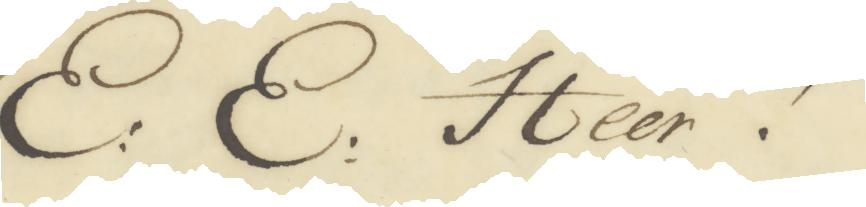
E: E: Heer!
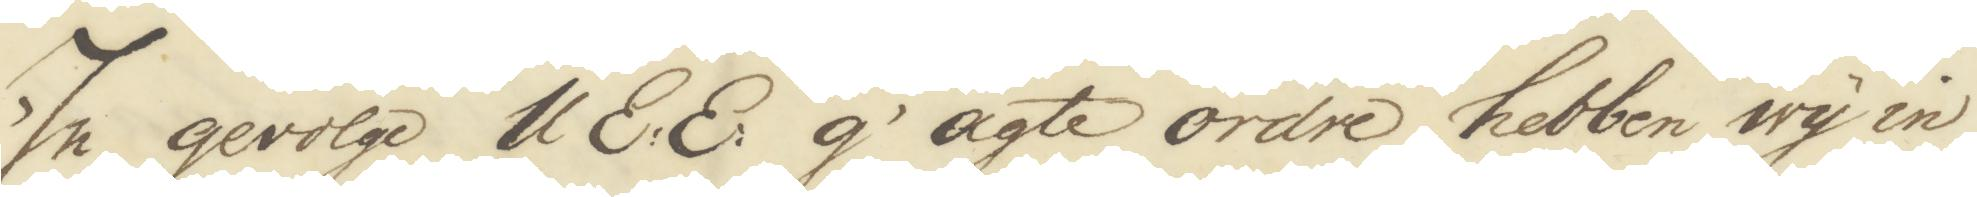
Jn gevolge U E: E: g’agte ordre hebben wij in
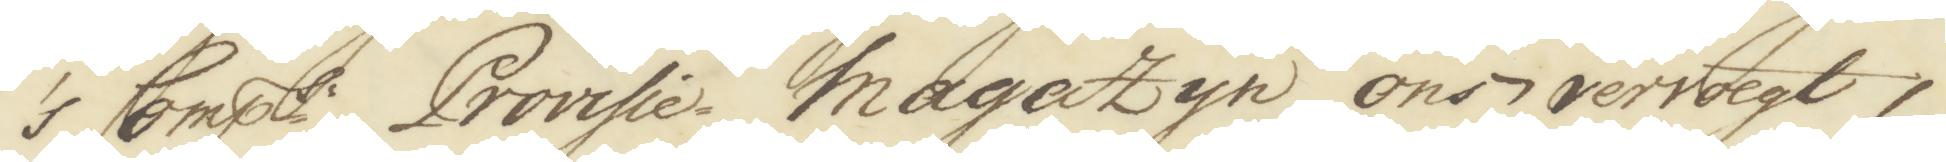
’s Comp=s: Provisie Magazyn ons vervoegt,
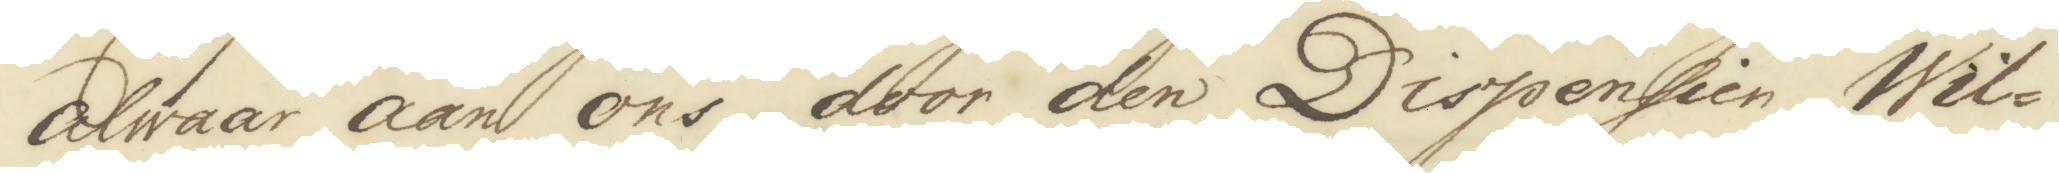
alwaar aan ons, door den Dispensien, Wil=
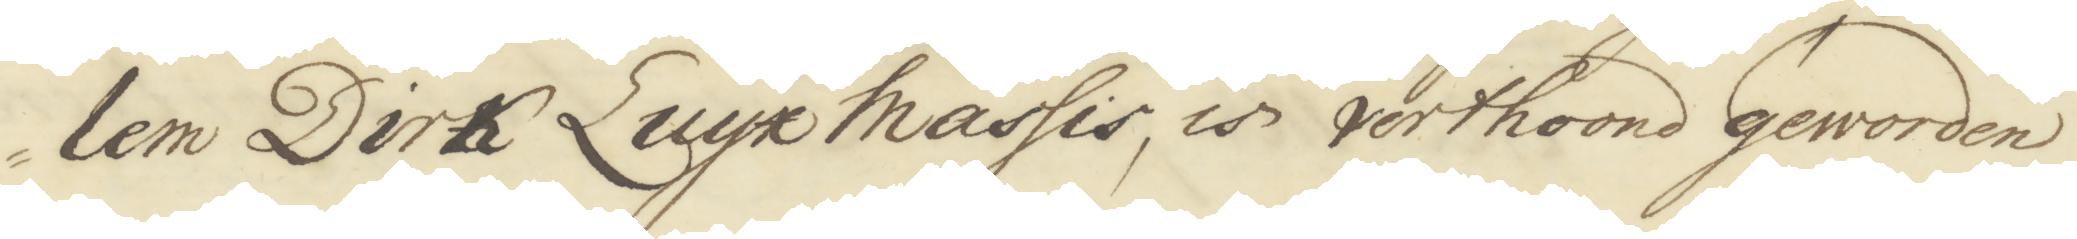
= lem Dirk Luyx Massis, is verthoond geworden
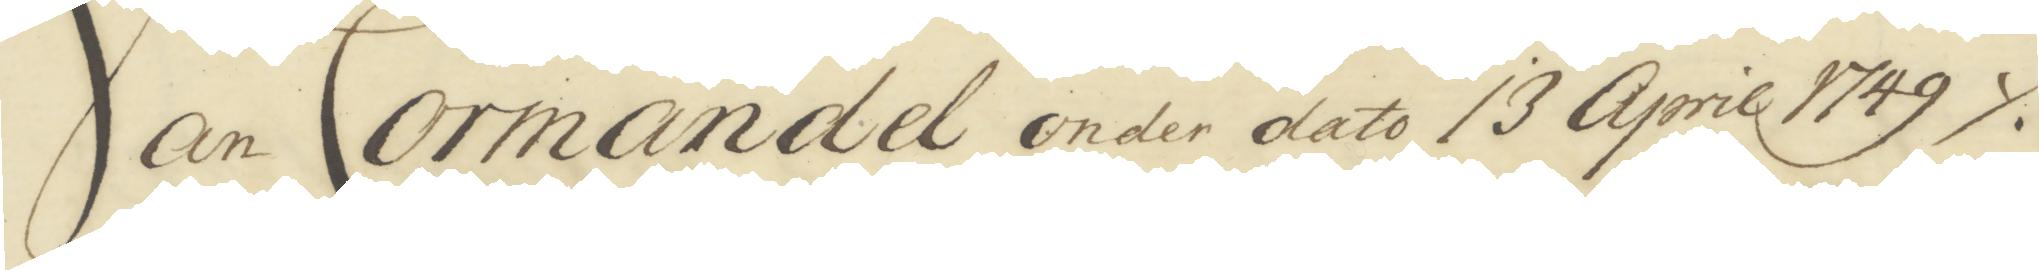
Van Cormandel onder dato 13 April 1749 ./.
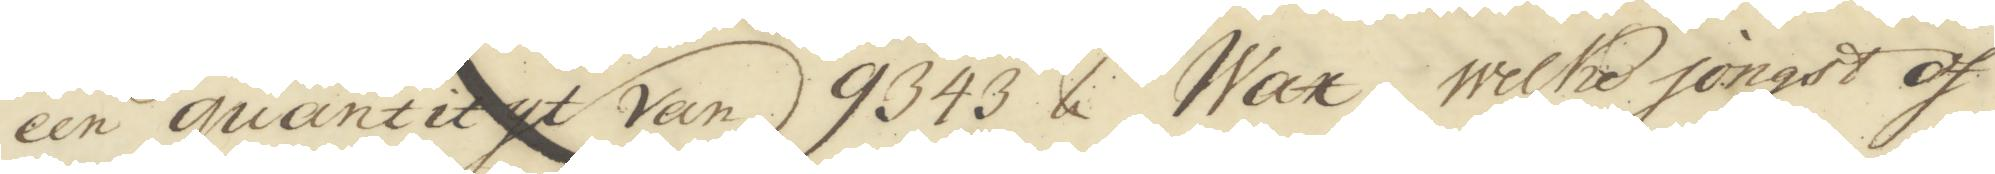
een quantitijt van 9343 lb Wax, welke jongst of
